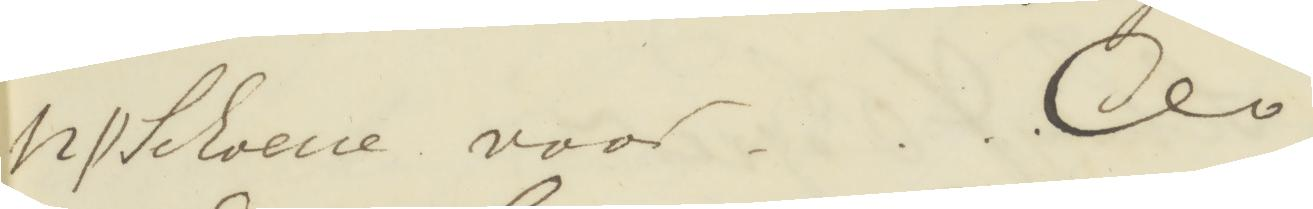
12 „ schoene voor . . . . Ceo
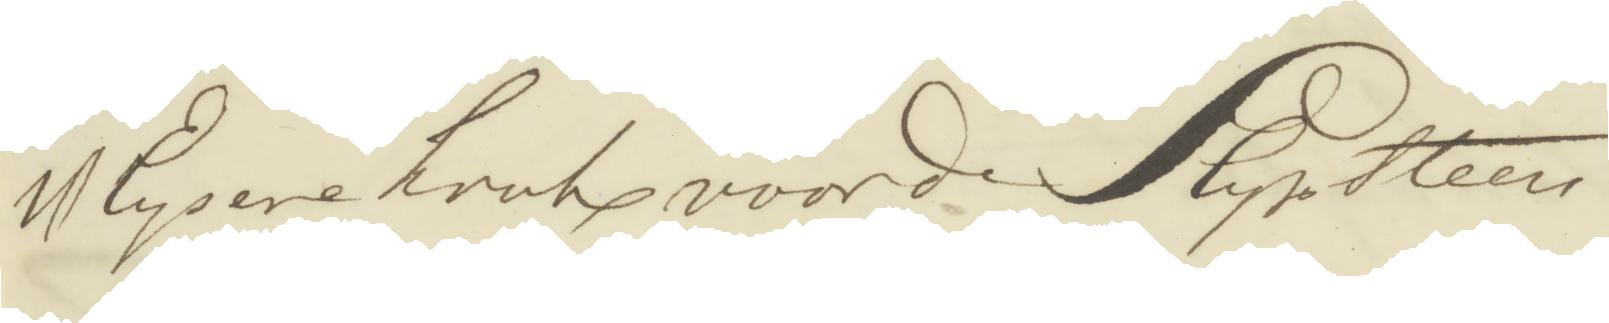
1 „ Eijsere kruk voor de Slypsteen
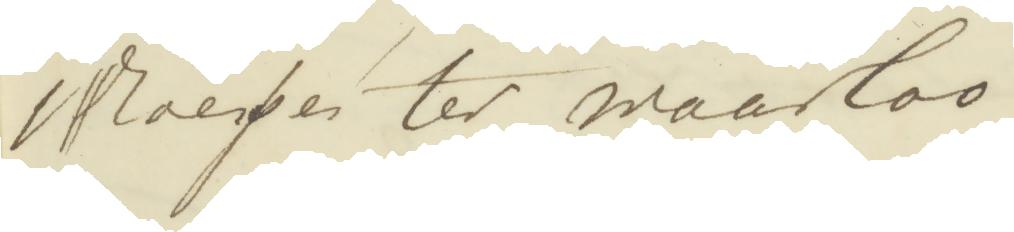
1 „ roeper ter waarloo
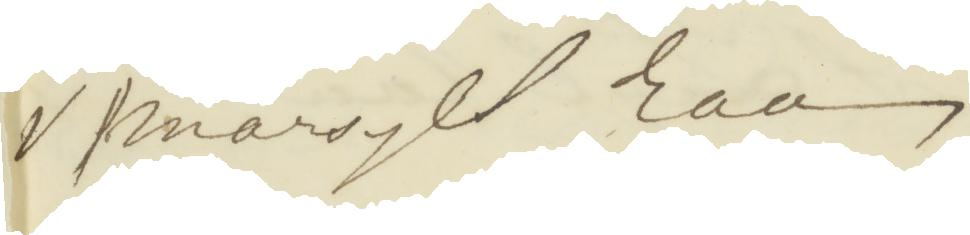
1 „ marsyls raa
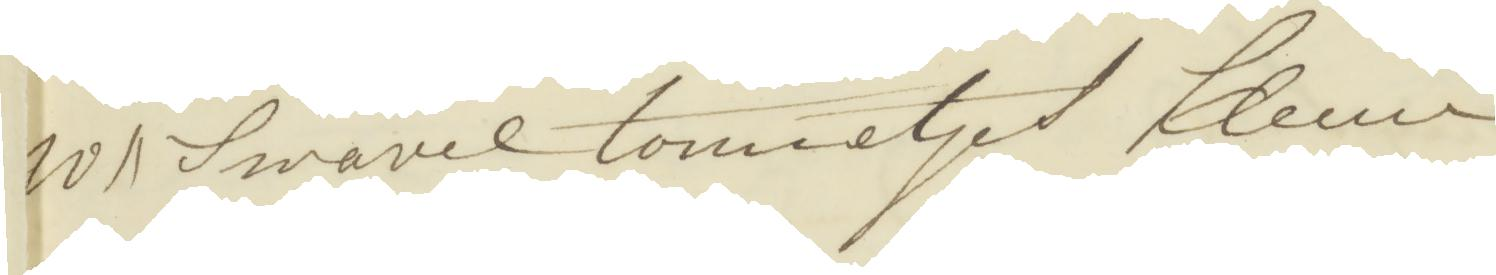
10 „ swavel tonnetjes kleene
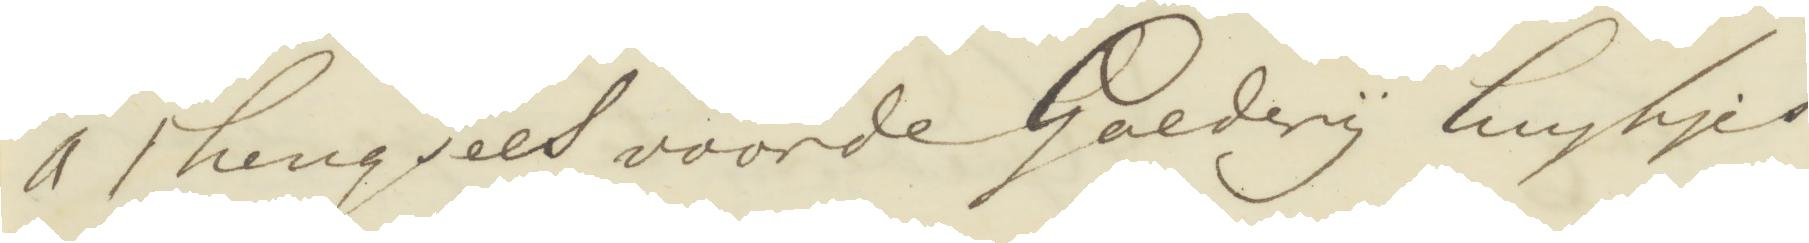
4 „ hengsels voorde Goederij luykjes
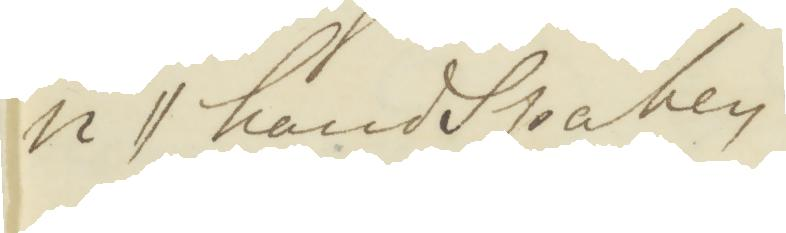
12 „ handspaken
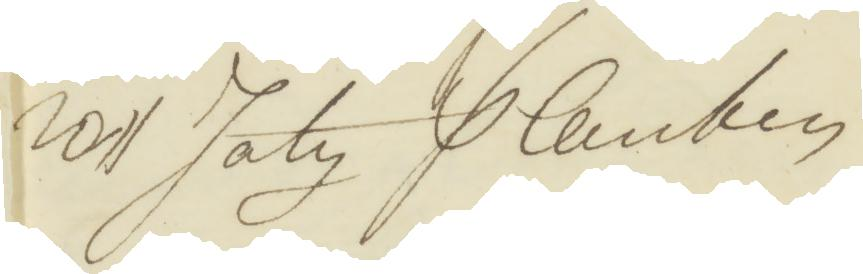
20 „ Jaty planken
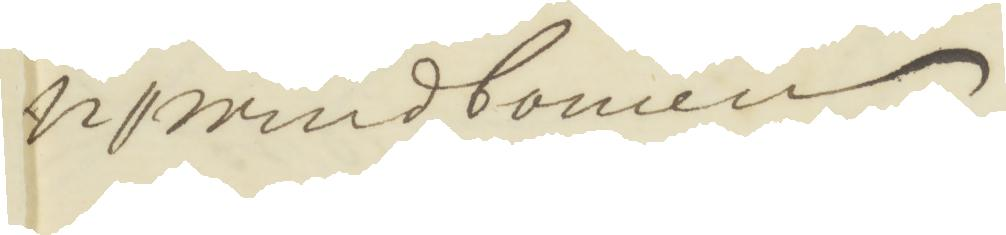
12 „ windbomen
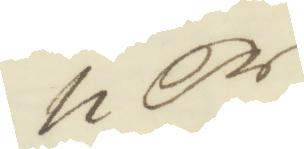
12 Ps
